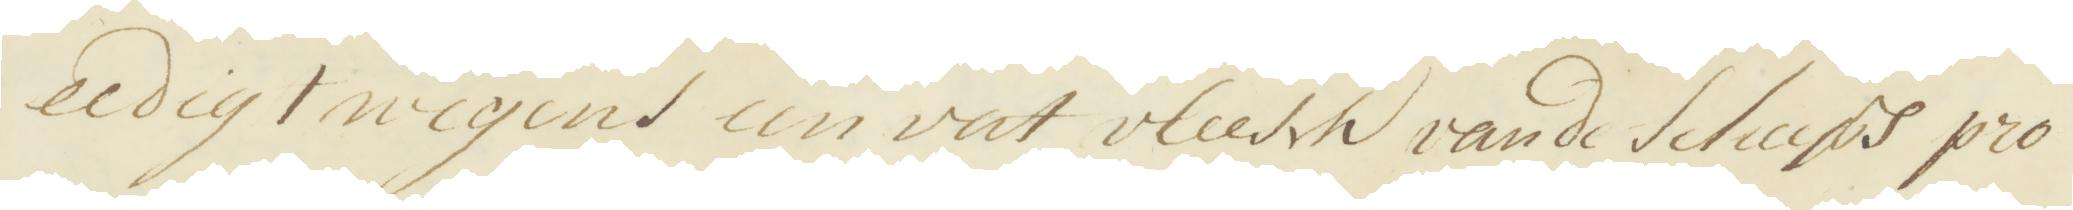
eedigt wegens een vat vleesch van de scheeps pro
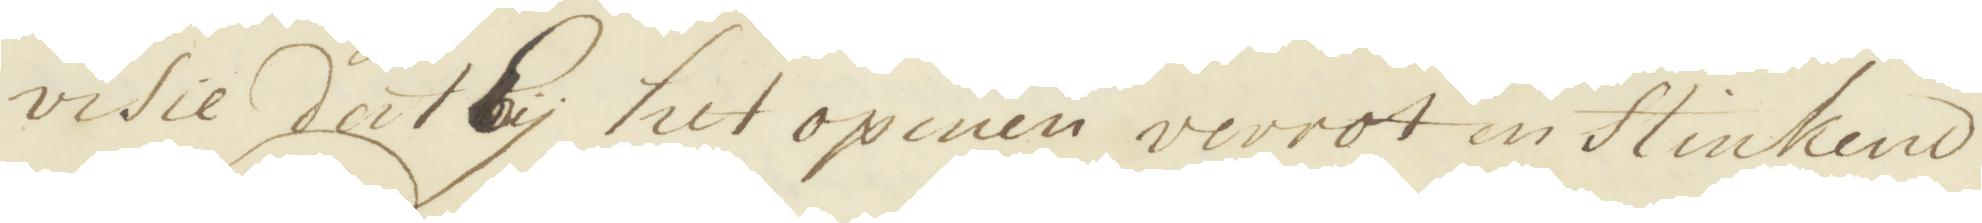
visie dat bij het openen verrot en stinkend
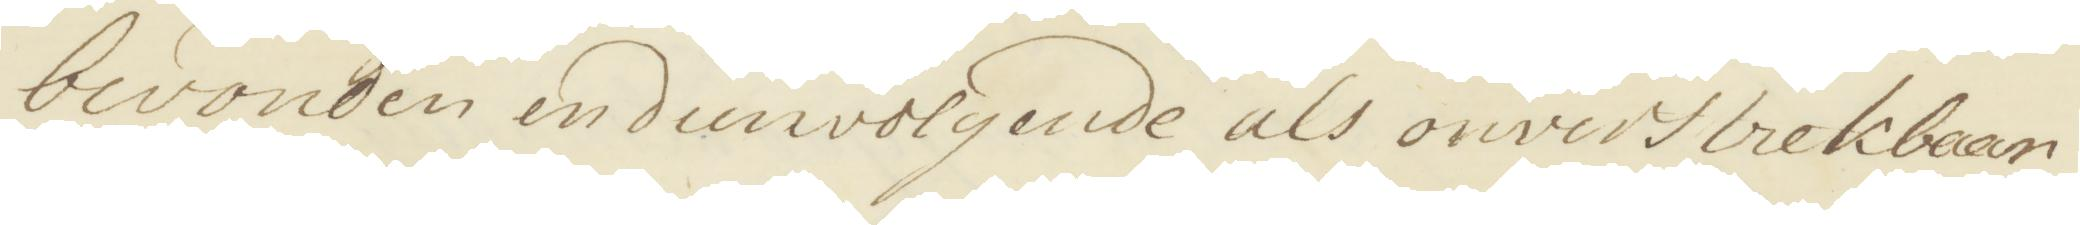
bevonden en dienvolgende als onverstrekbaar
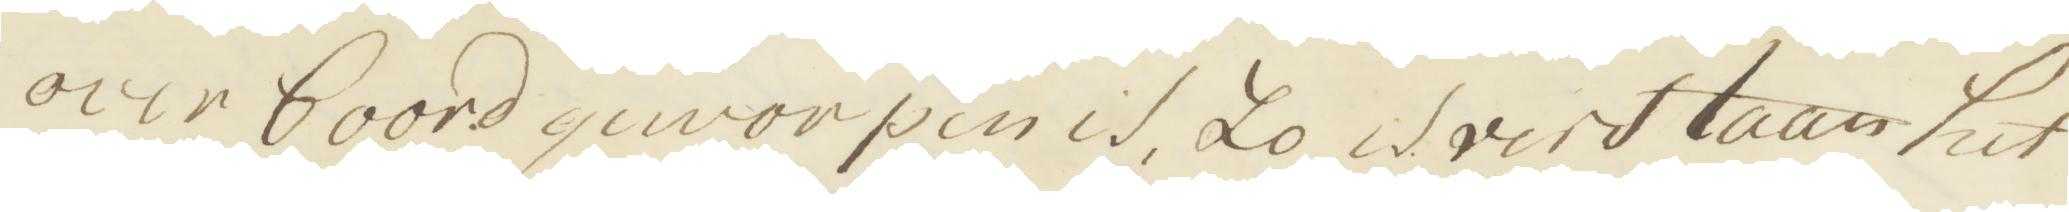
over boord geworpen is, zo is verstaan het
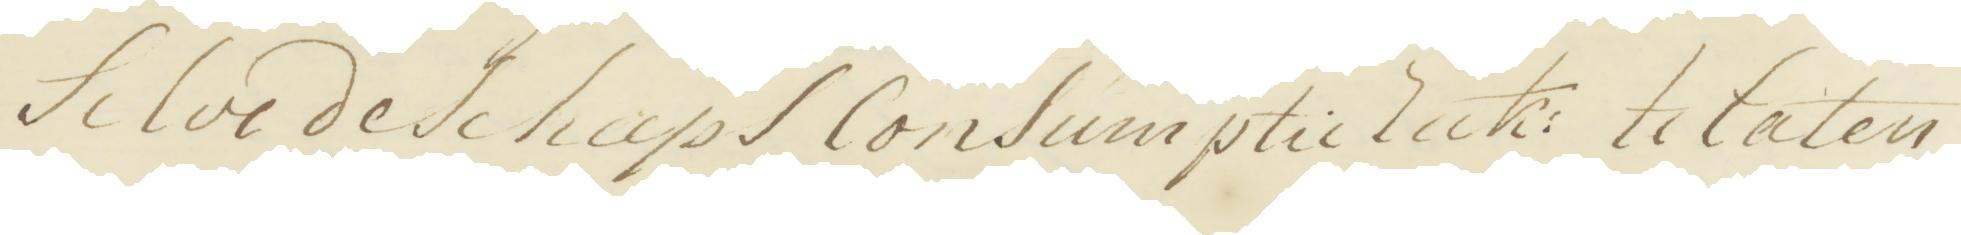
selve de scheeps Consumptie reek: te laten
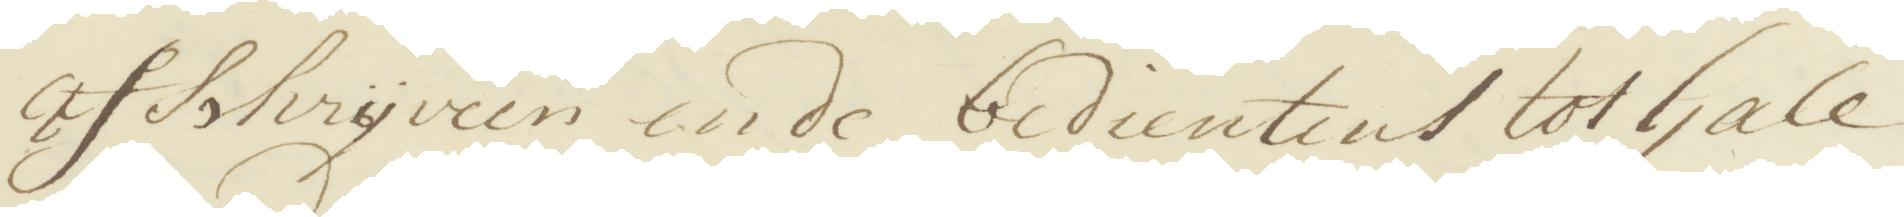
afschrijveen en de bedientens tot Gale
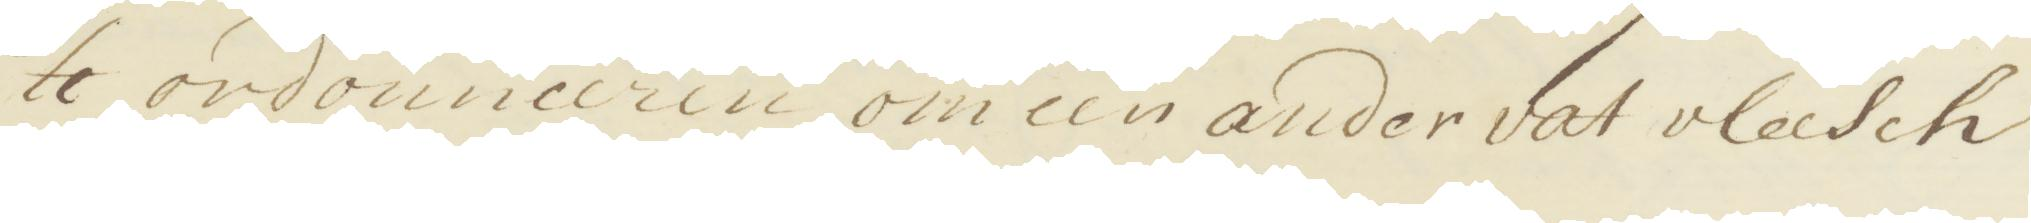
te ordonneeren om een ander dat vleesch
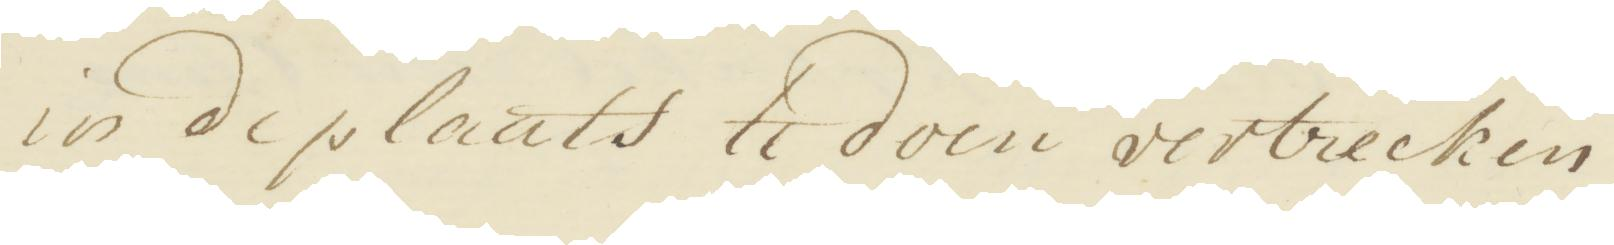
in de plaats te doen vertrecken
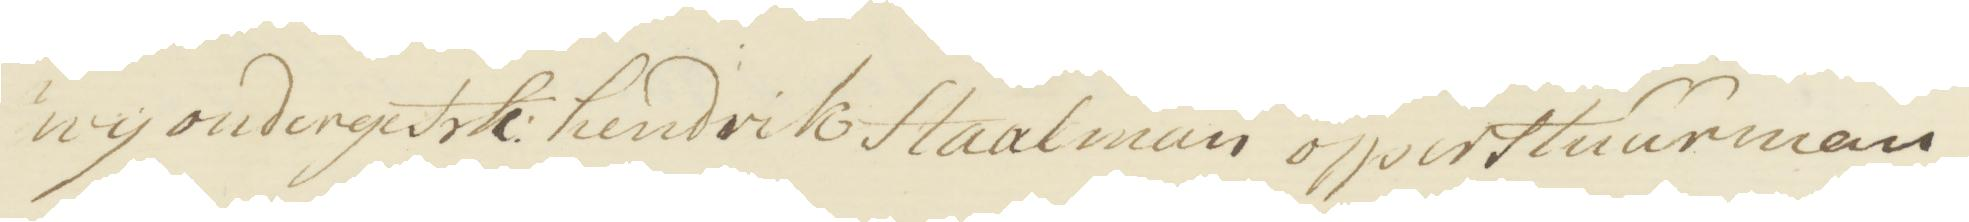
wij ondergesck: hendrik staalman opperstuurman,
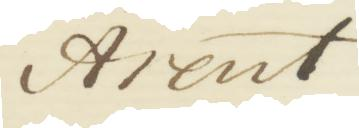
Arent
